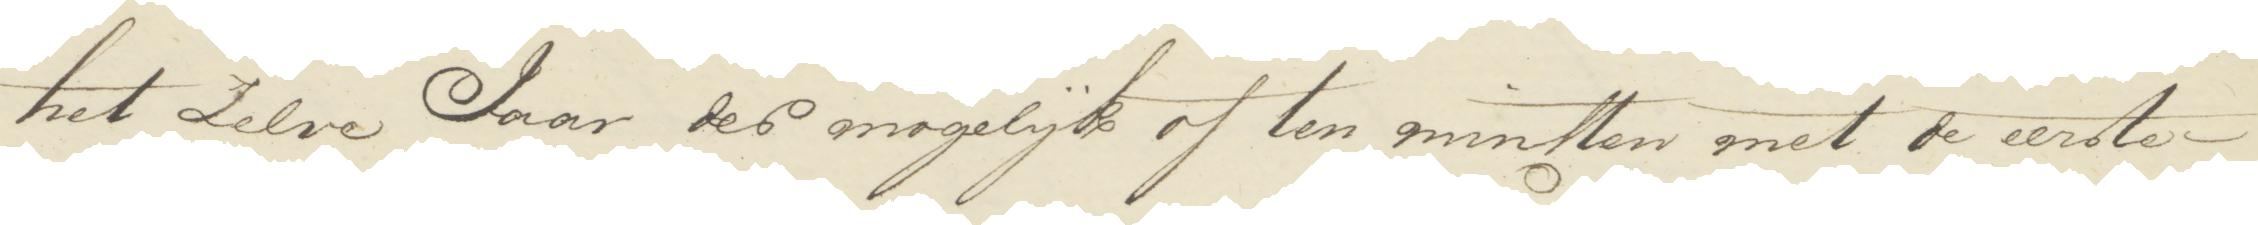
het zelve Iaar des mogelijk of ten minsten met de eerste
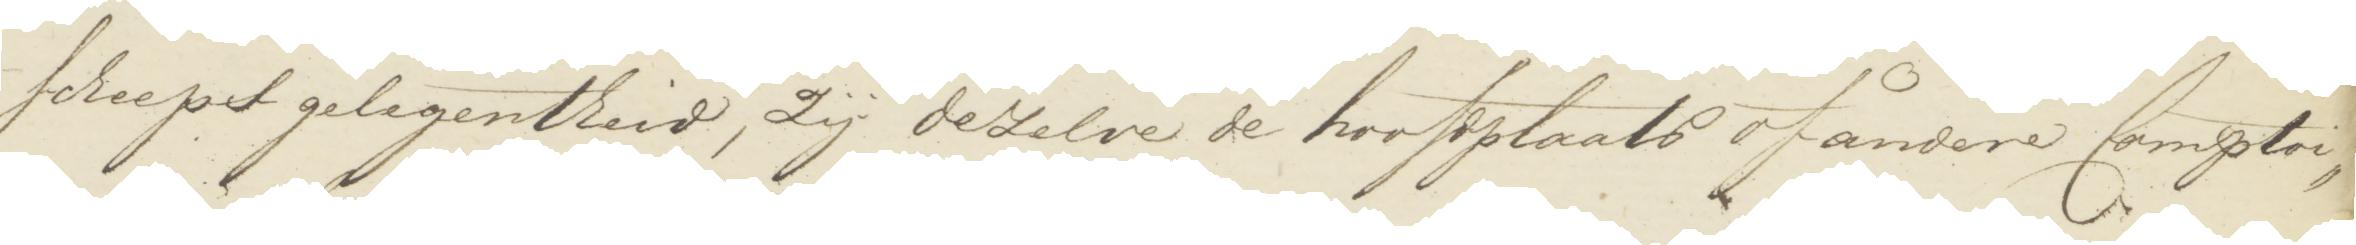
Scheeps gelegentheid, Zij dezelve de hoofdplaats of andere Comptoi„
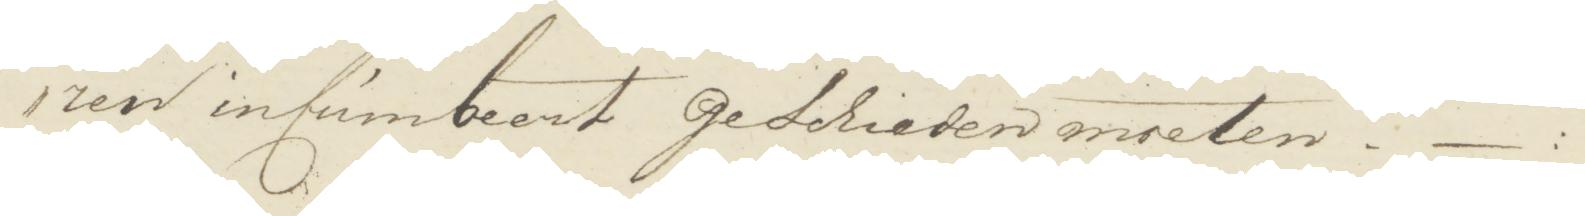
„ren incumbeert geschieden moeten.—:
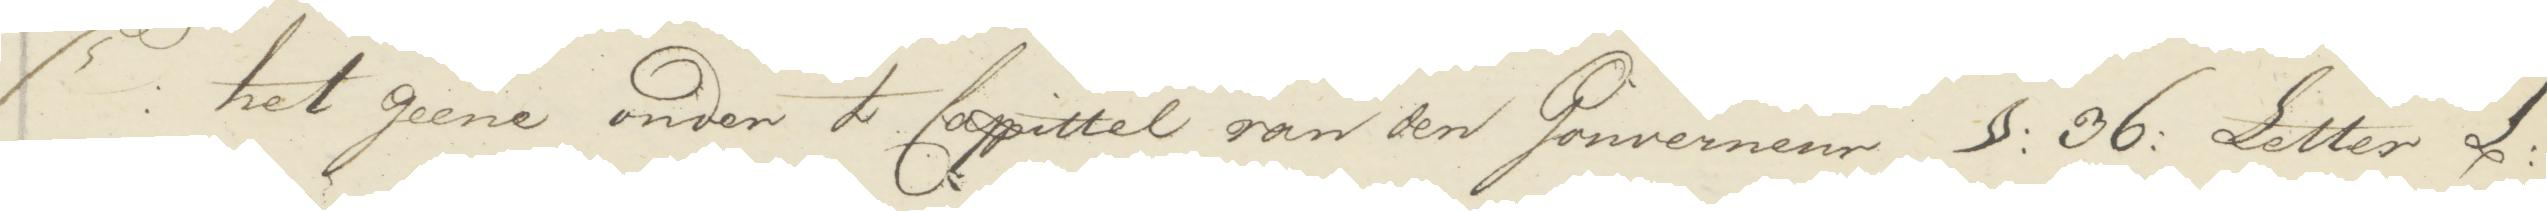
C: het geene onder 't Cappittel van den Gouverneur §: 36: Letter L:
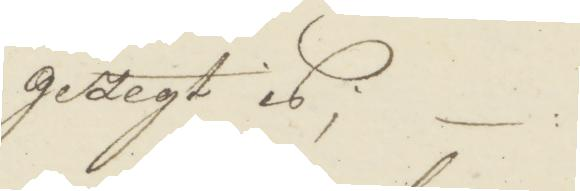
gezegt is;—:
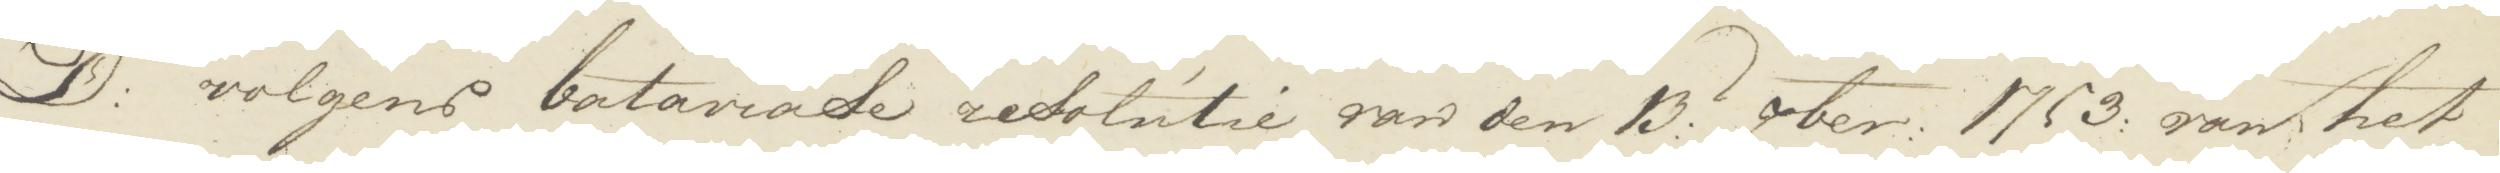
D: volgens bataviase resolutie van den 13:' 7ber: 1753: van het
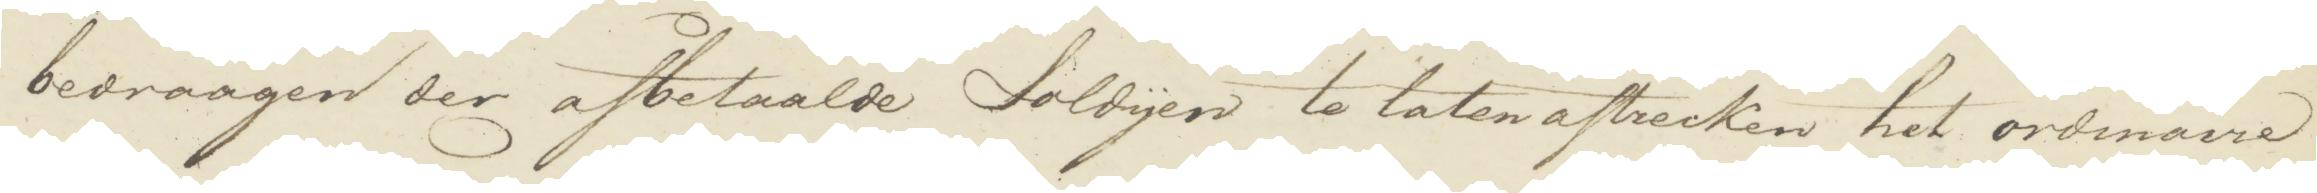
bedraagen der afbetaalde Soldijen te laten aftrecken het ordinaire
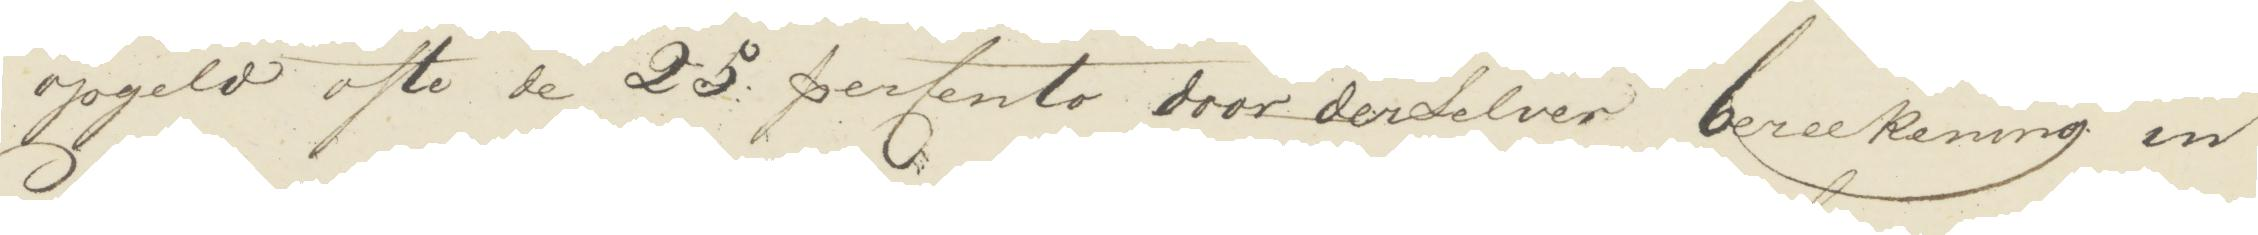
opgeld ofte de 25: percento door derselver bereekening in
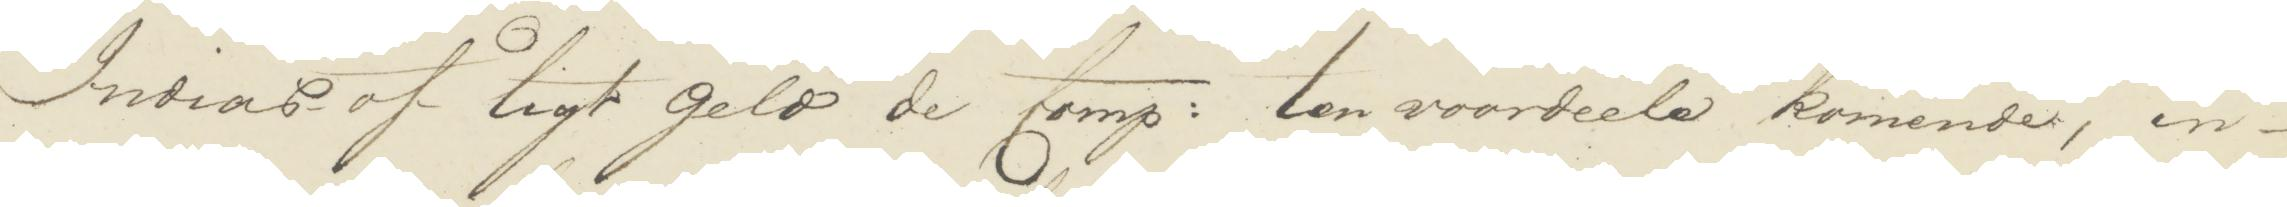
Indias of ligt geld de Comp: ten voordeele komende, in-
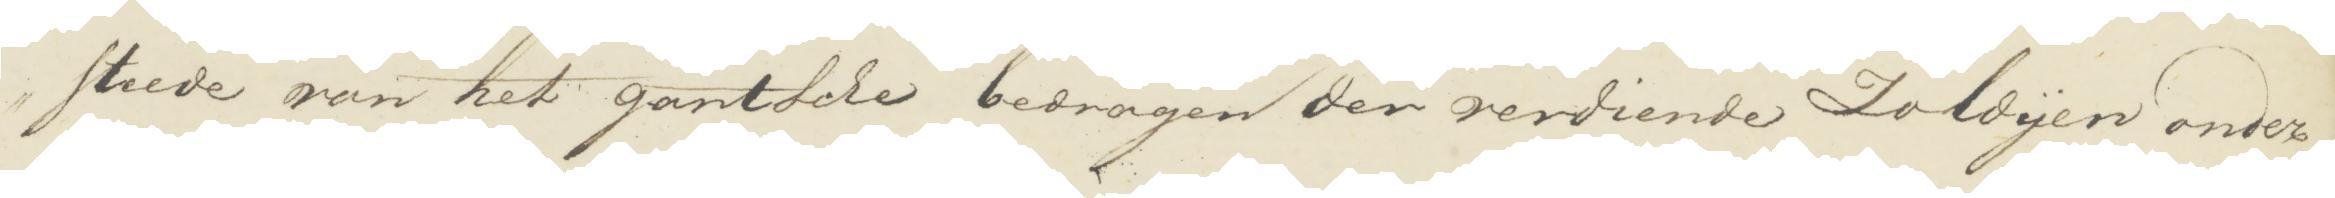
„steede van het gantsche bedragen der verdiende Zoldijen onder
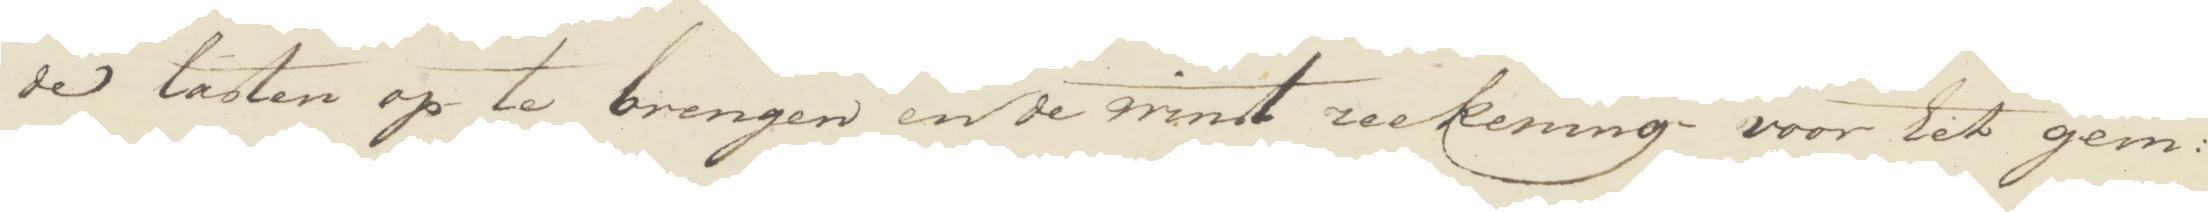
de lasten op te brengen en de winst reekening voor het gem:e
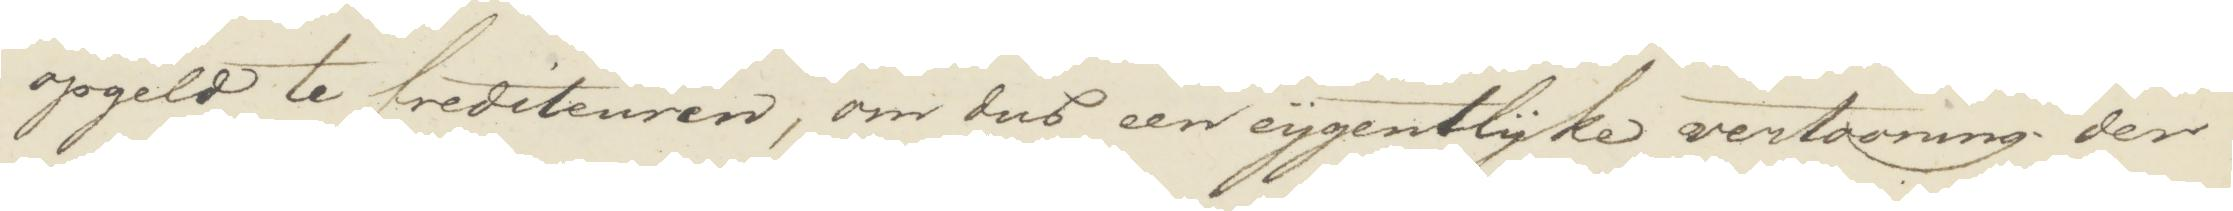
opgeld te crediteuren, om dus een eijgentlijke vertooning der
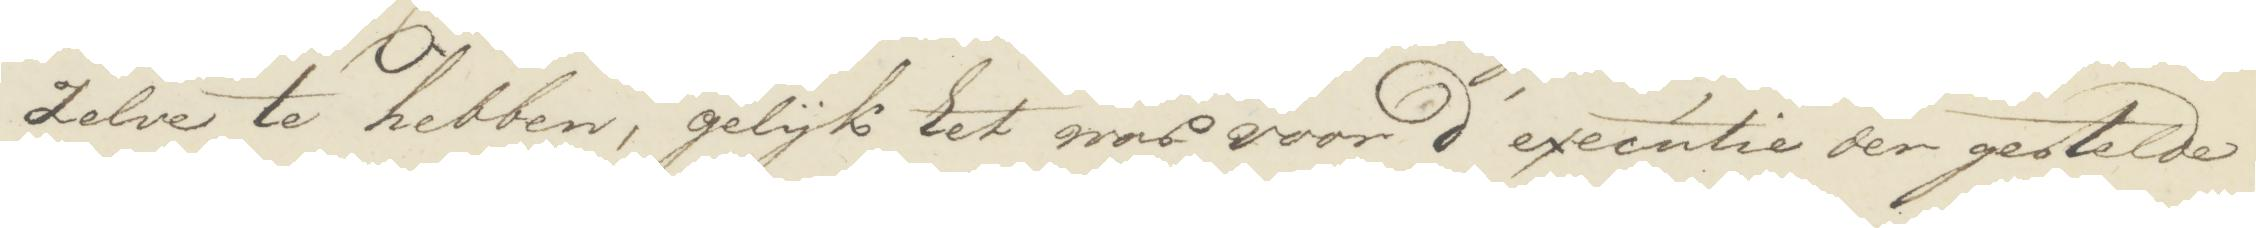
Zelve te hebben, gelijk het was voor d’ executie der gestelde
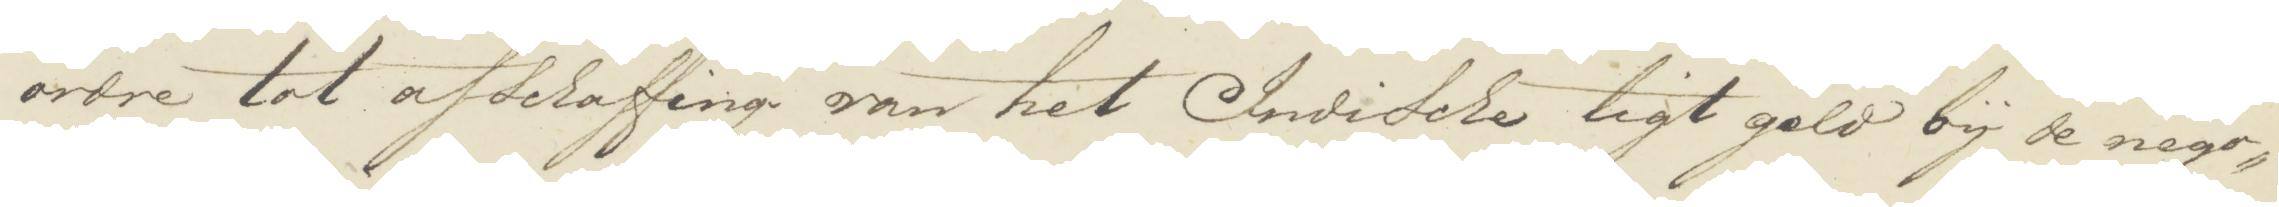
ordre tot afschaffing van het Indische ligt geld bij de nego„
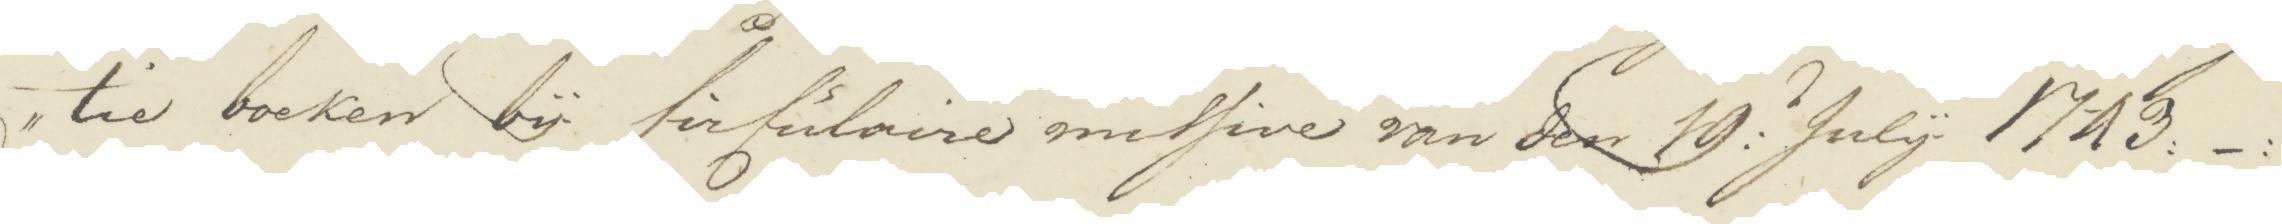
„tie boeken bij Circulaire missive van den 19:' Julij 1743:_:
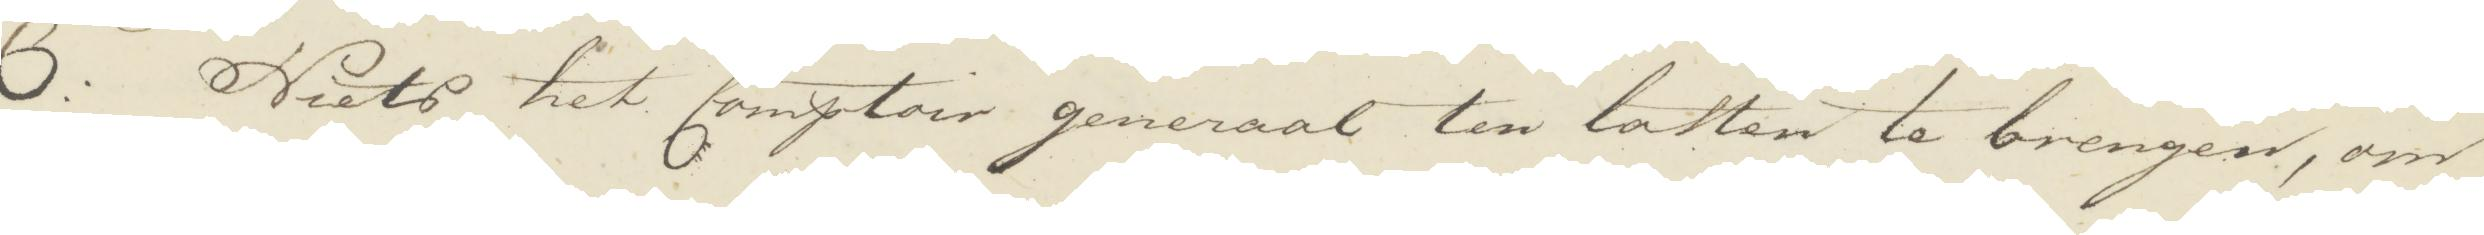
E: Niets het comptoir generaal ten lasten te brengen, om
